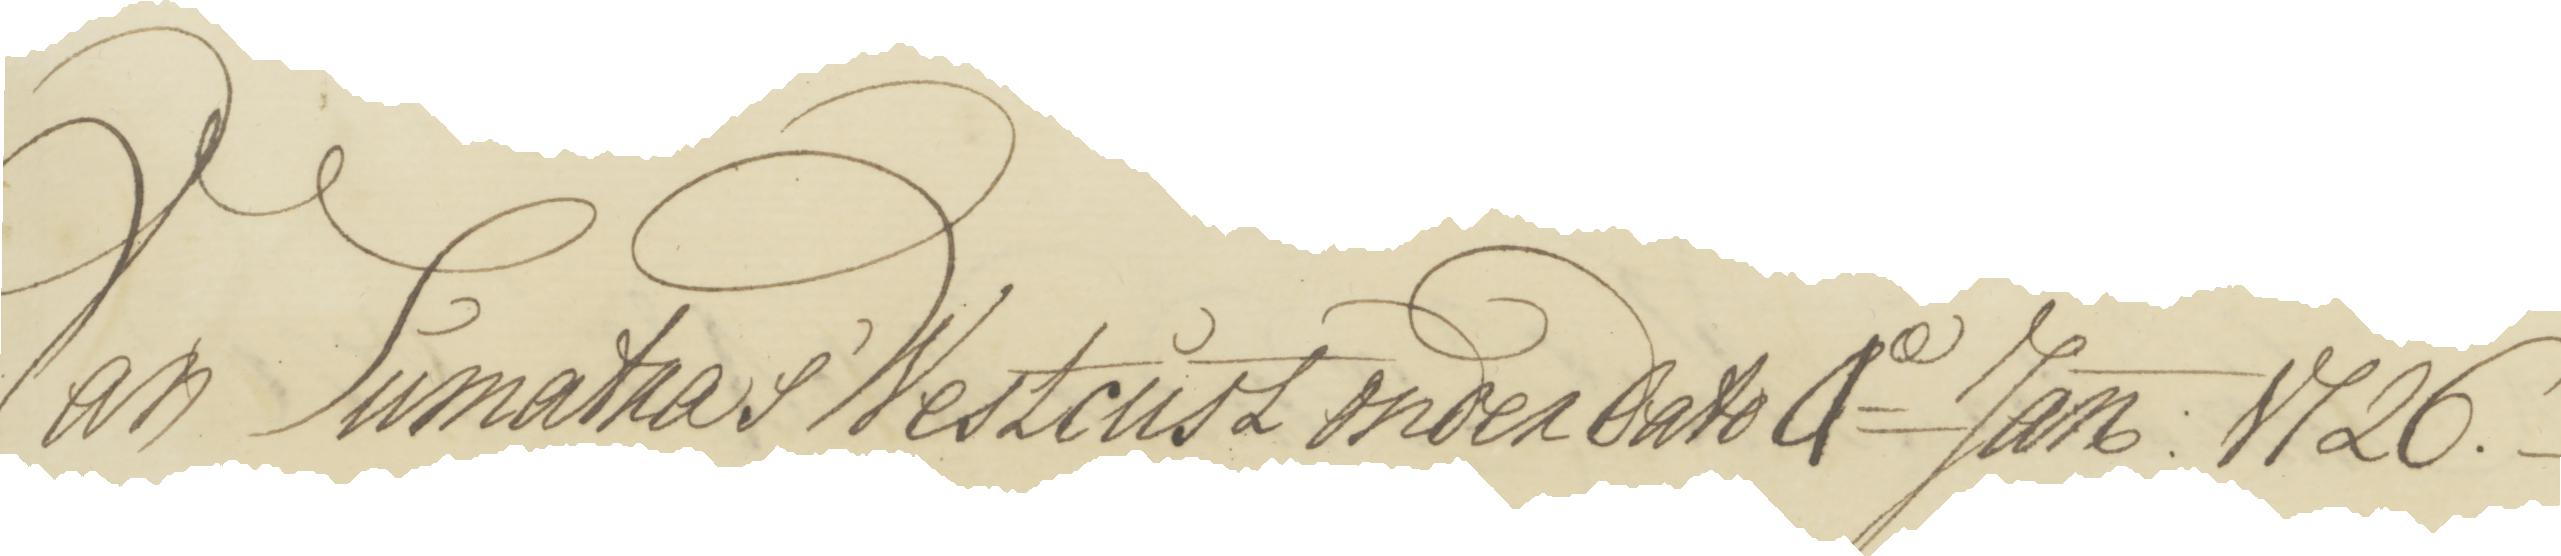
Van Sumatra s' Westcust onder dato 4:e Jan: 1726.
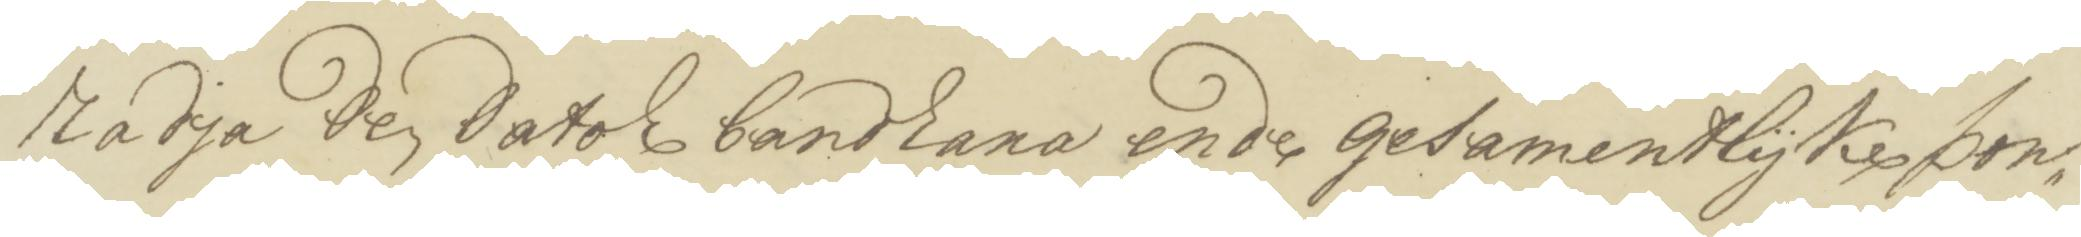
radja den datoh bandhara ende gesamentlijke pon„
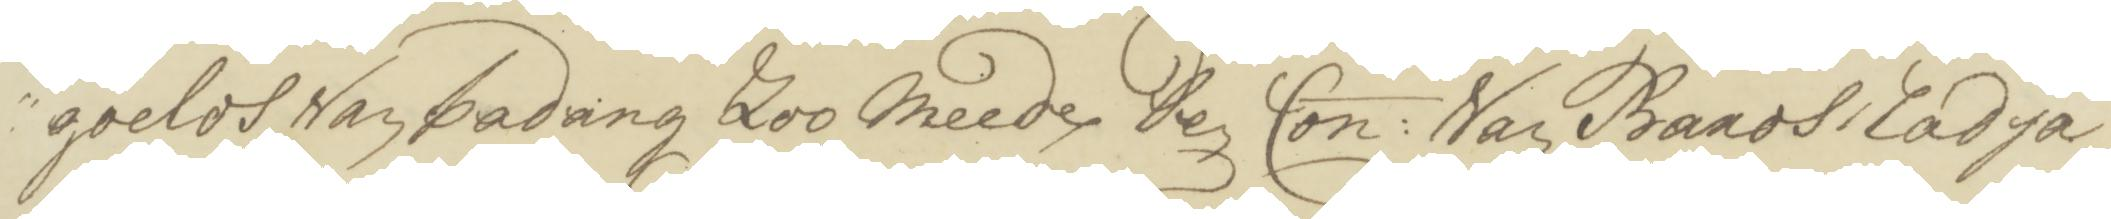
„goeles van padang Zoo meede den Con: Van Baros radja
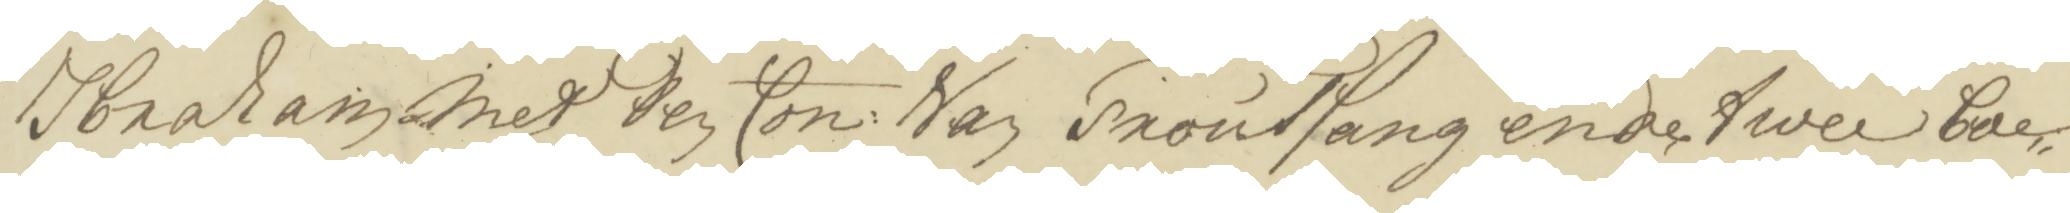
Ibraham met den Con: Van Troussang en de twee boe„
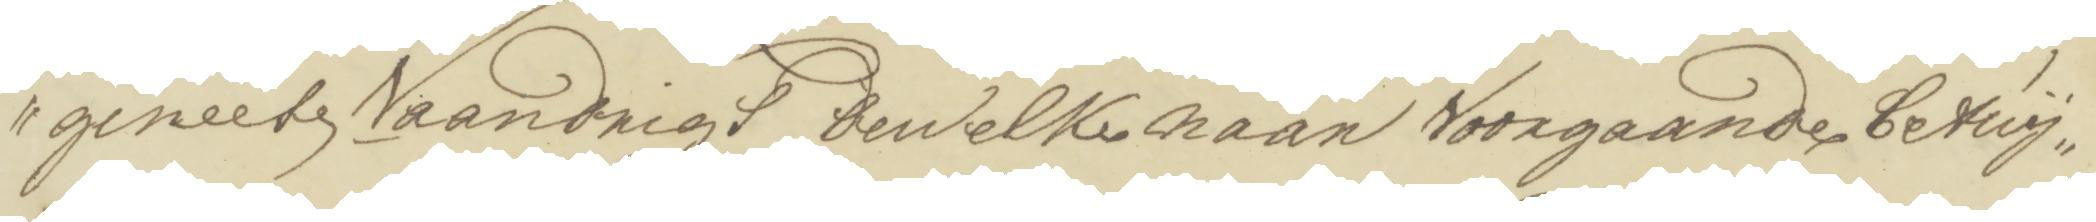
„gineese Vaandrigs dewelk naar Voorgaande betuij„
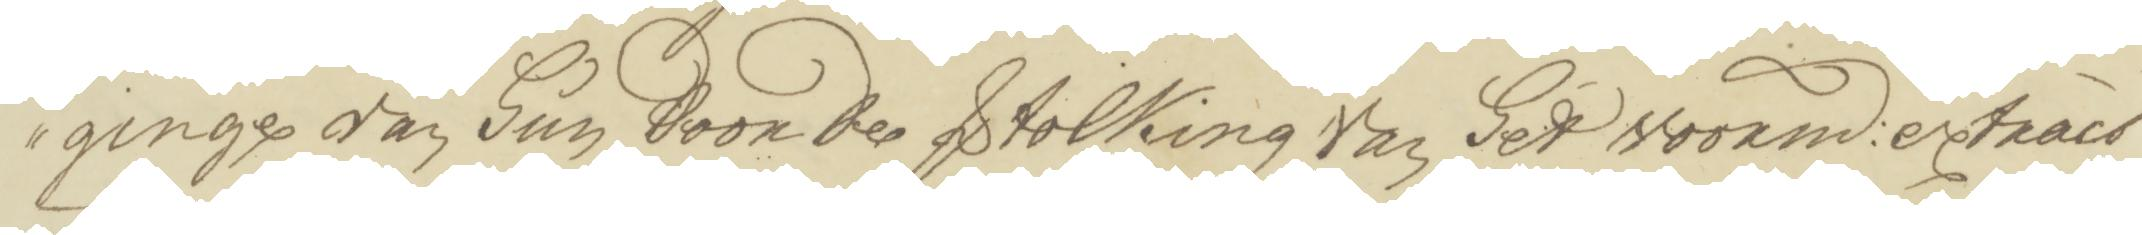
„ginge van hun door de vertolking van het voorm: extract
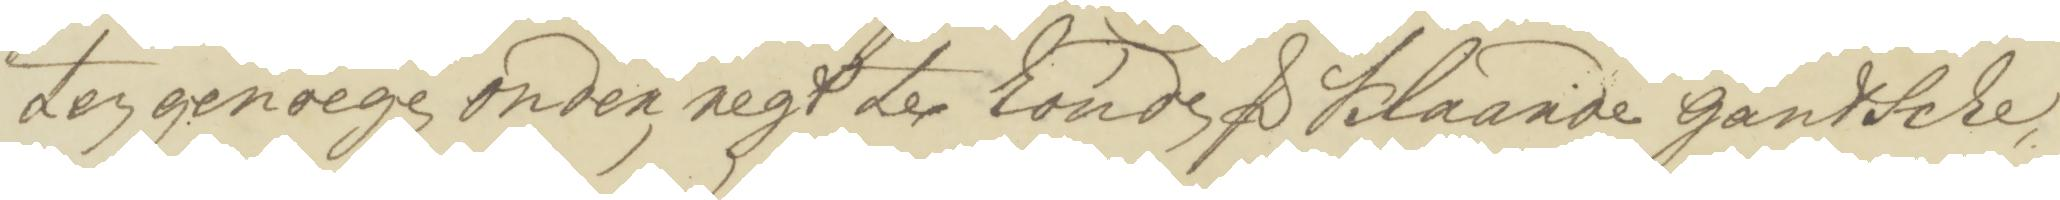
den genoege onder regt te houden ver klaarde gantsche
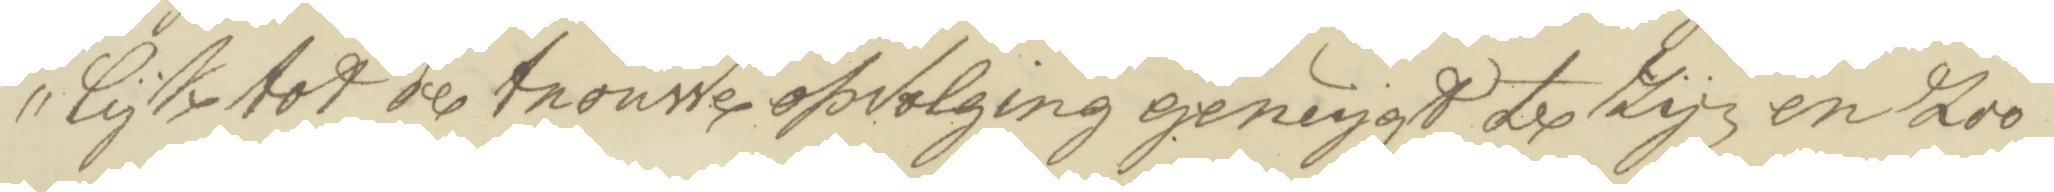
„lijk tot de trouwe opvolging geneijgt te Zijn en Zoo
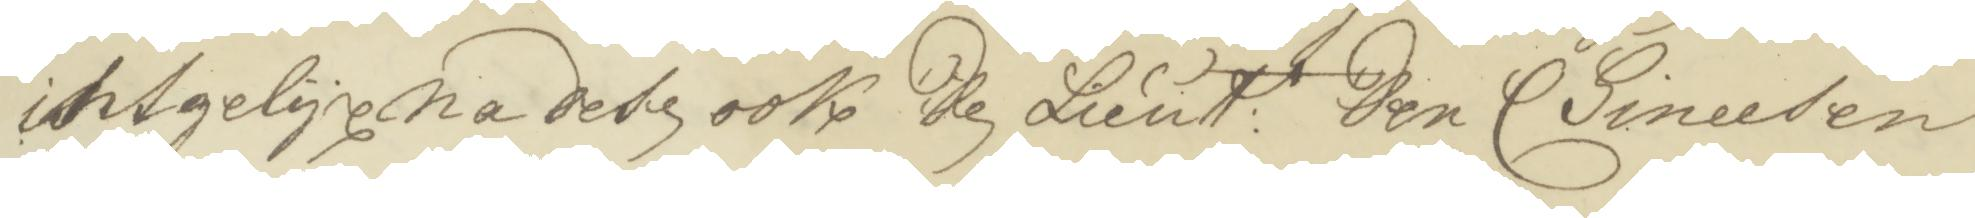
insgelijx na dese ook de Lieut:t der Chineesen
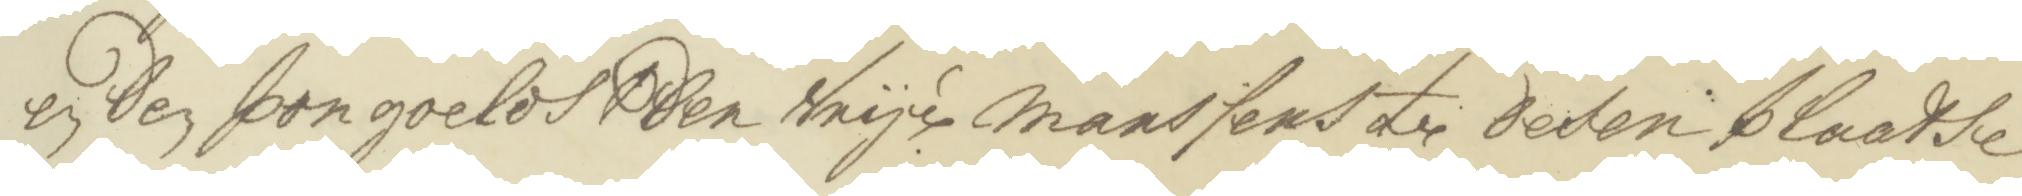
en den pongoeles der vrije niarssers te desen plaatse
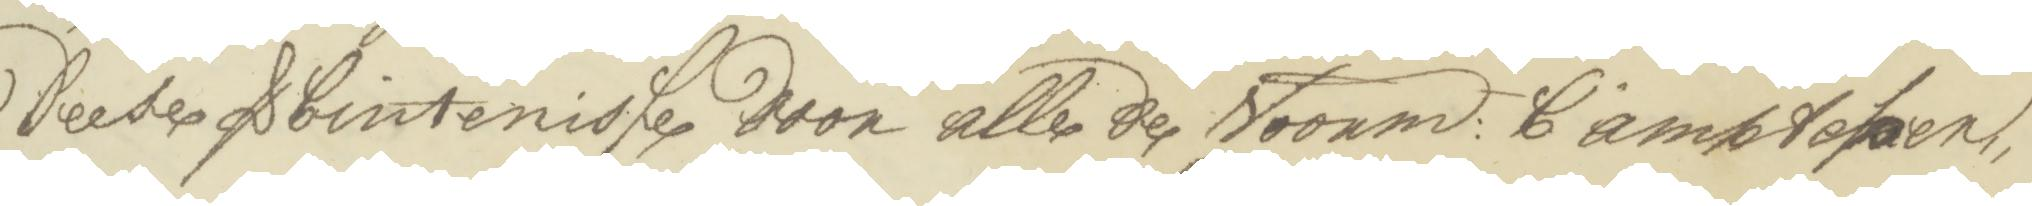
deese verbintenisse door alle de Voorm: b'ampteper„
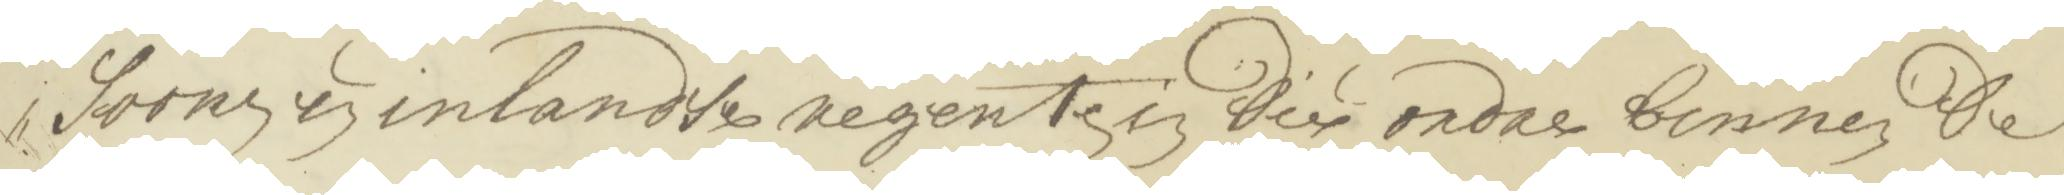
soonen en inlandse regenten in de ordre binnen de
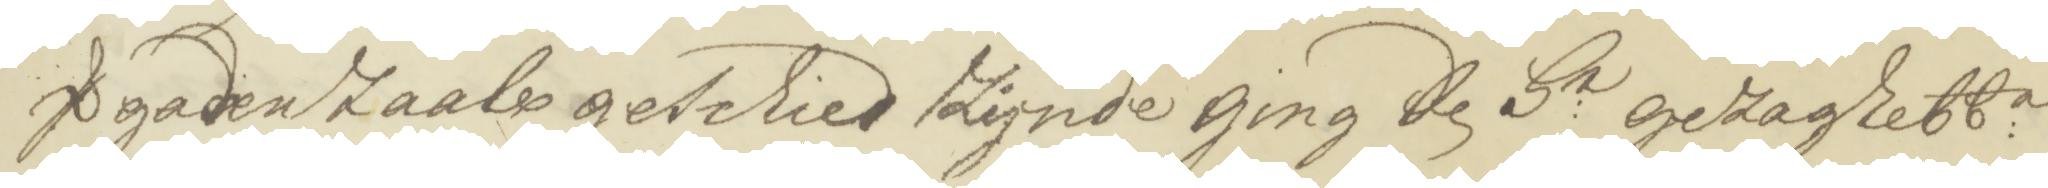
vergader Zaale geschied Zijnde ging de h:r gezaghebb:r
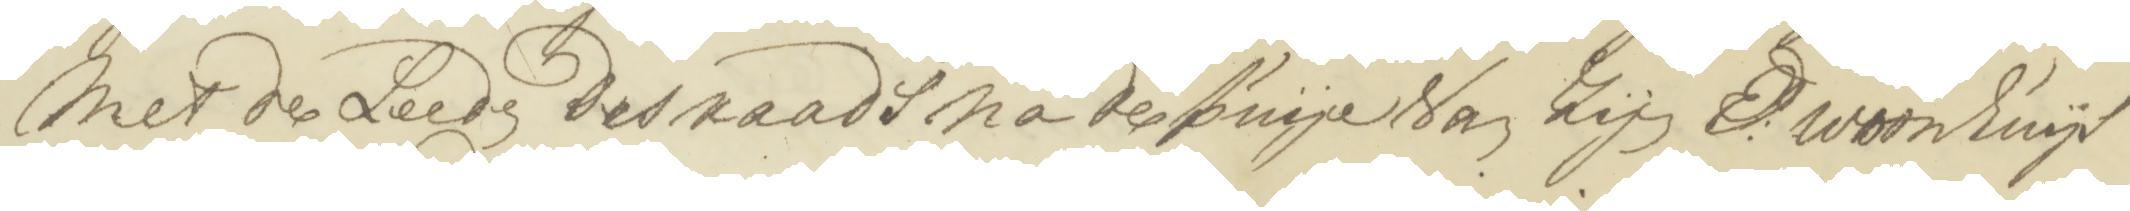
met de Leeden des raads na de puije Van Zijn E:d woonhuijs
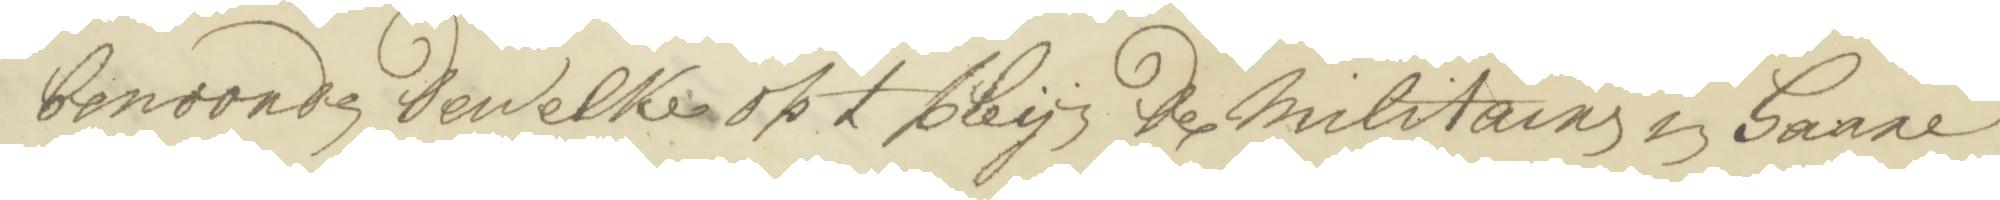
benoorden dewelke op 't pleijn, de militairen in haare
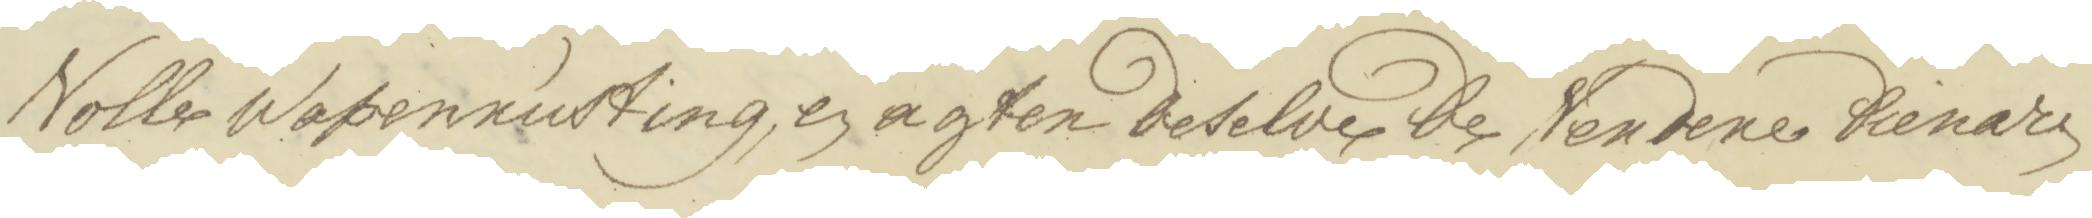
Volle wapenrusting en agter deselve de Verdere dienaren
